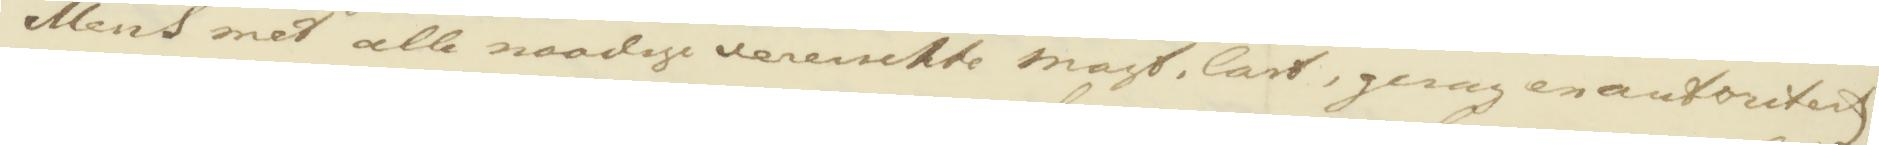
Mens met alle noodige vereischte magt, last, gezag en autoriteit
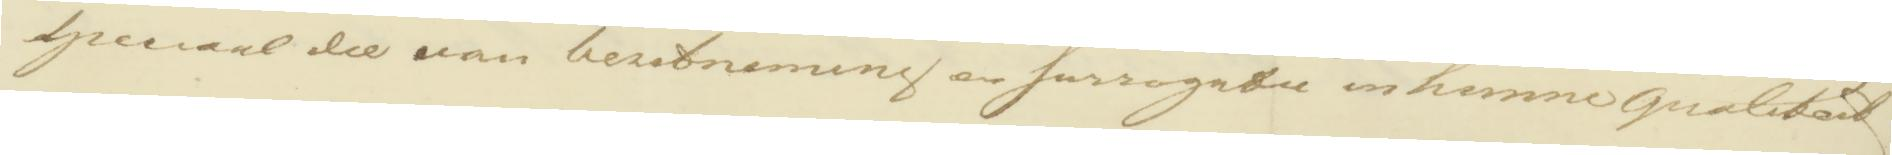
speciaal die van bezitneming en surrogatie in hunne qualiteit
